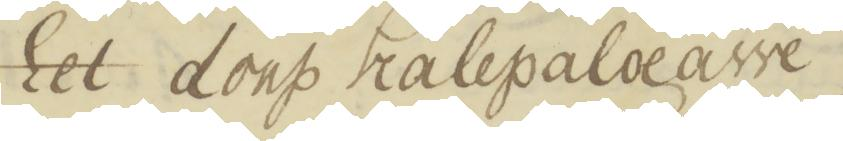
het dorp kalepaloeawe
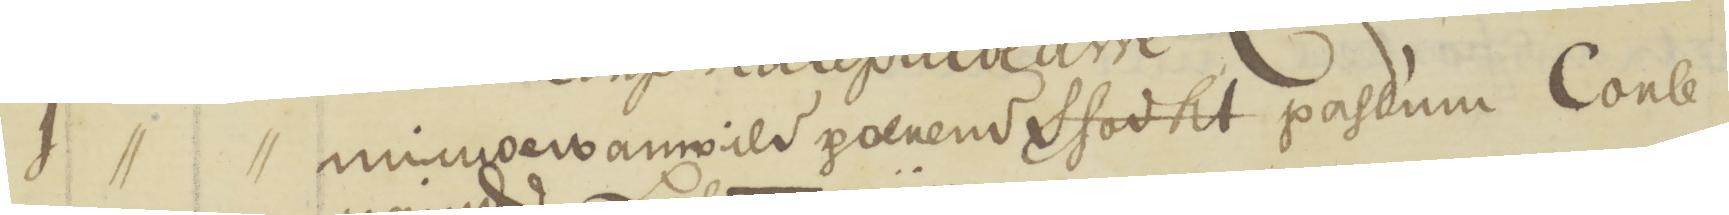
1 „ „ mimoewanwile poerene versoekt pasdum Corle
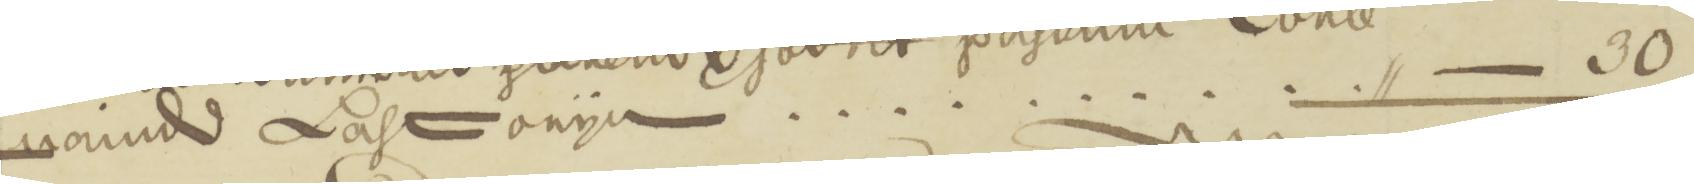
nainde Lascorijn . . . . . . . . . . „ — 30
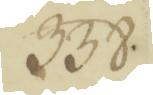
338.
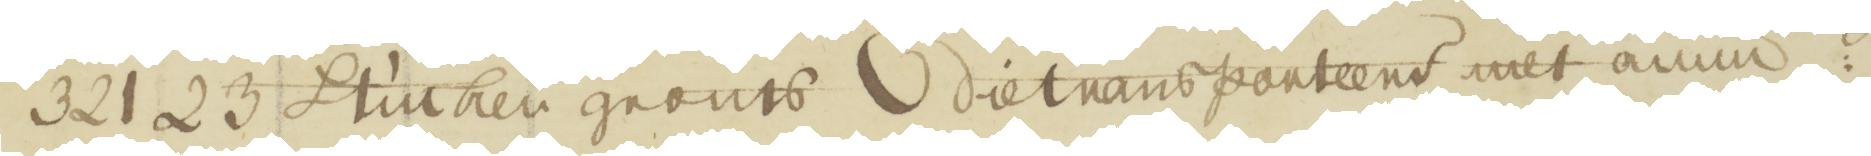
321 23 Stucken gronts die transporteere met amm:s
